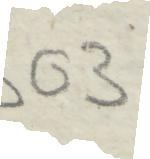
03.
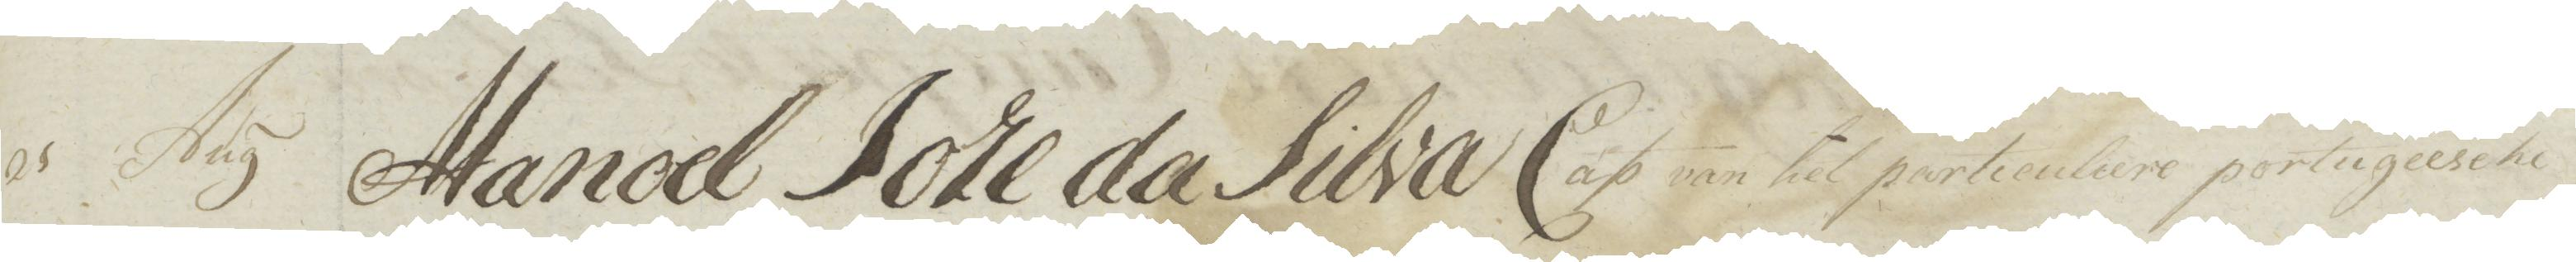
21 Aug Manoel Joze da Silva Cap van het particuliere portugeesche
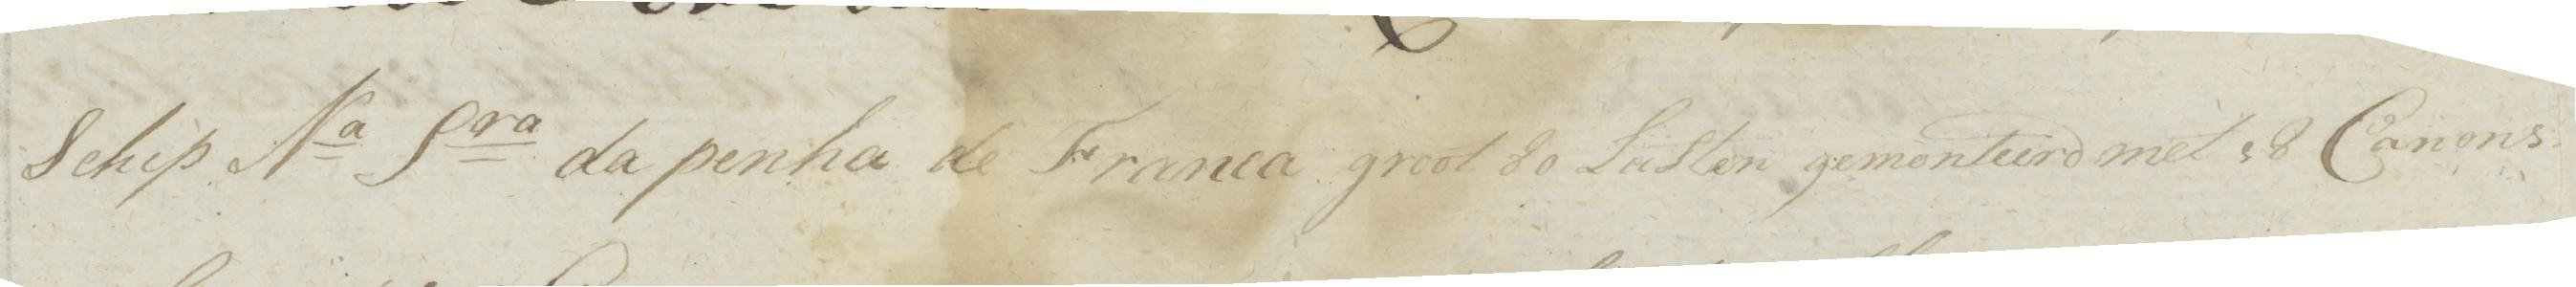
schip A=a S=ra da penha de Franca groot 80 Lasten gemonteerd met 18 Canons
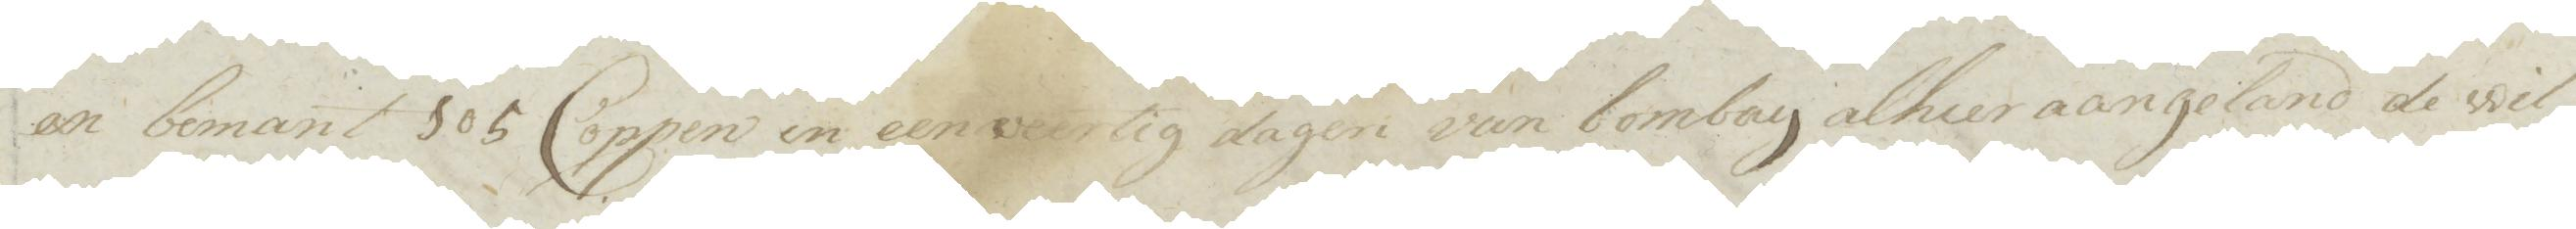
en bemant 305 Coppen en een veertig dagen van bombay alhier aan geland de wil
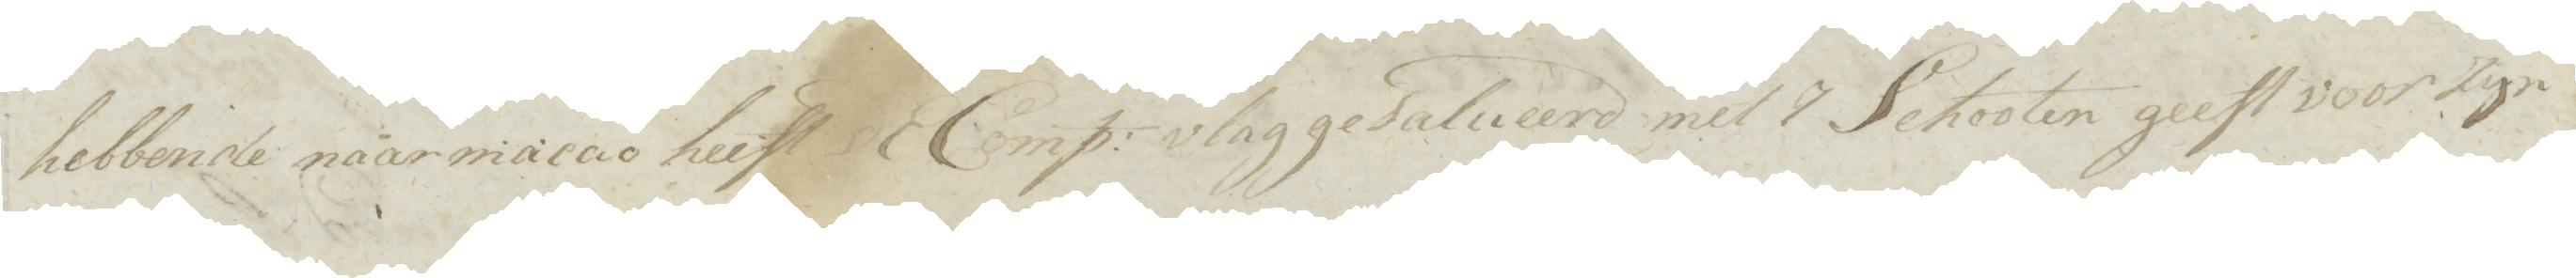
hebbende naar macao heeft E Comp:s vlag gesalueerd met 7 schooten geeft voor zyn
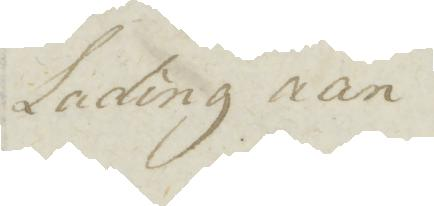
lading aan
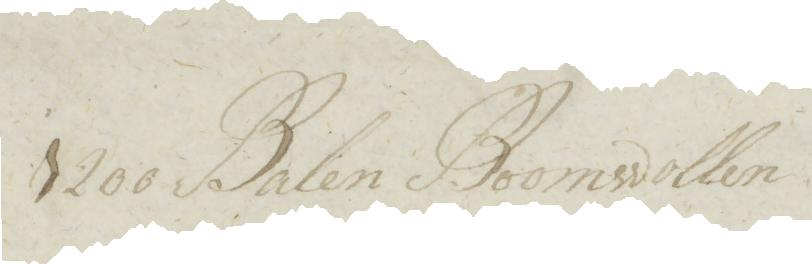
1200 Balen Boomwollen
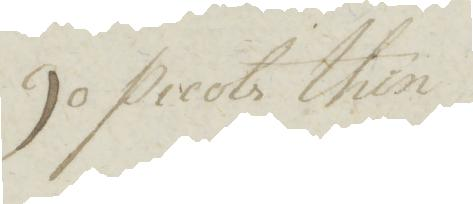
90 picol thin
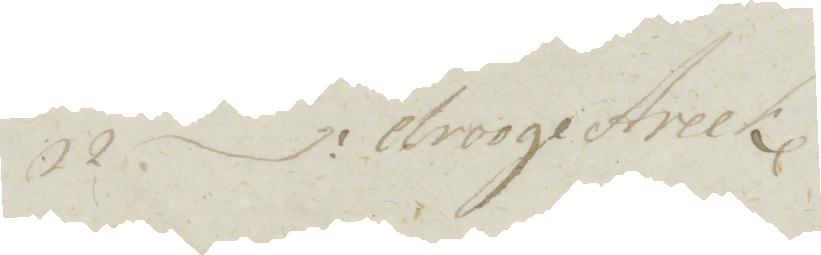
22. d:o drooge Areek
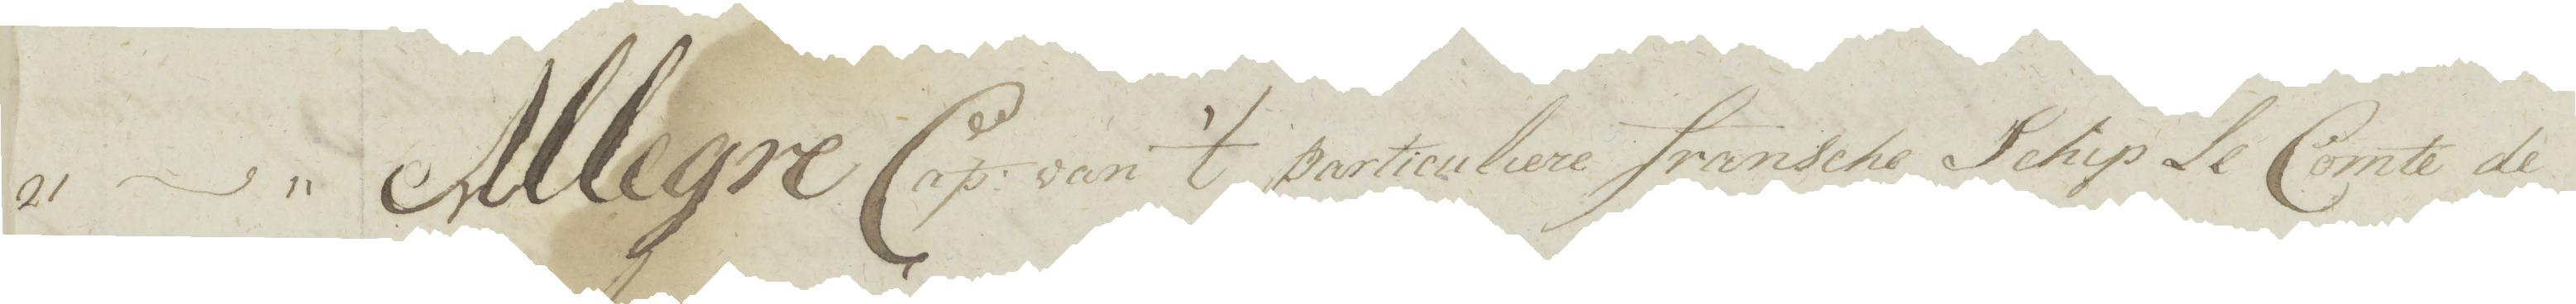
21 _o „ Allegre Cap: van 't particuliere fransche schip Le Comte de
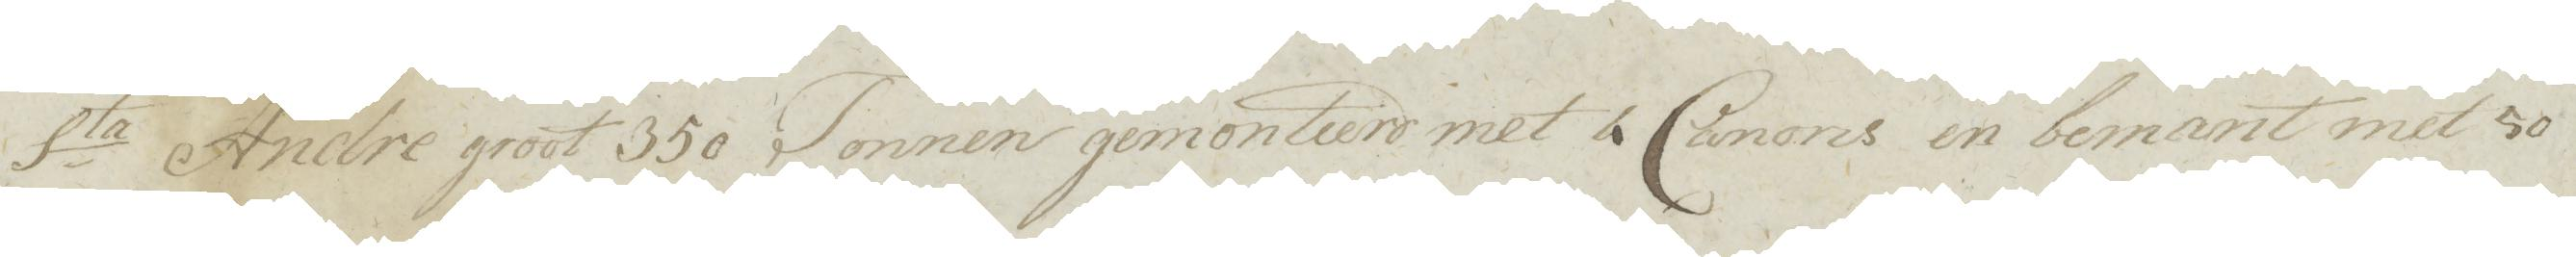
S=ta Andre groot 350 Tonnen gemonteerd met 4 Canons en bemant met 50
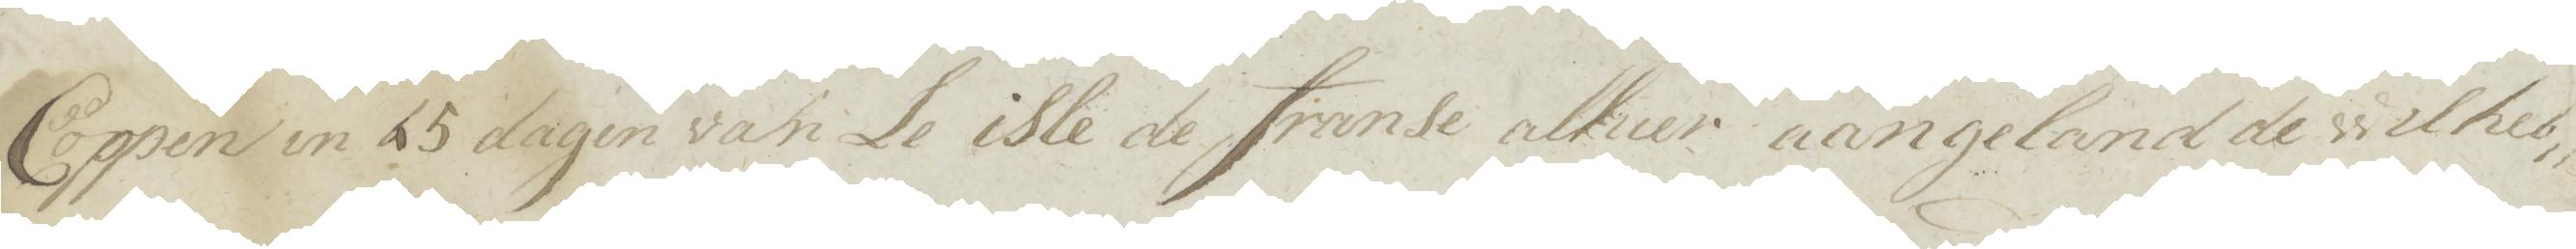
Coppen en 45 dagen van Le isle de franse alhier aangeland de wil heb„
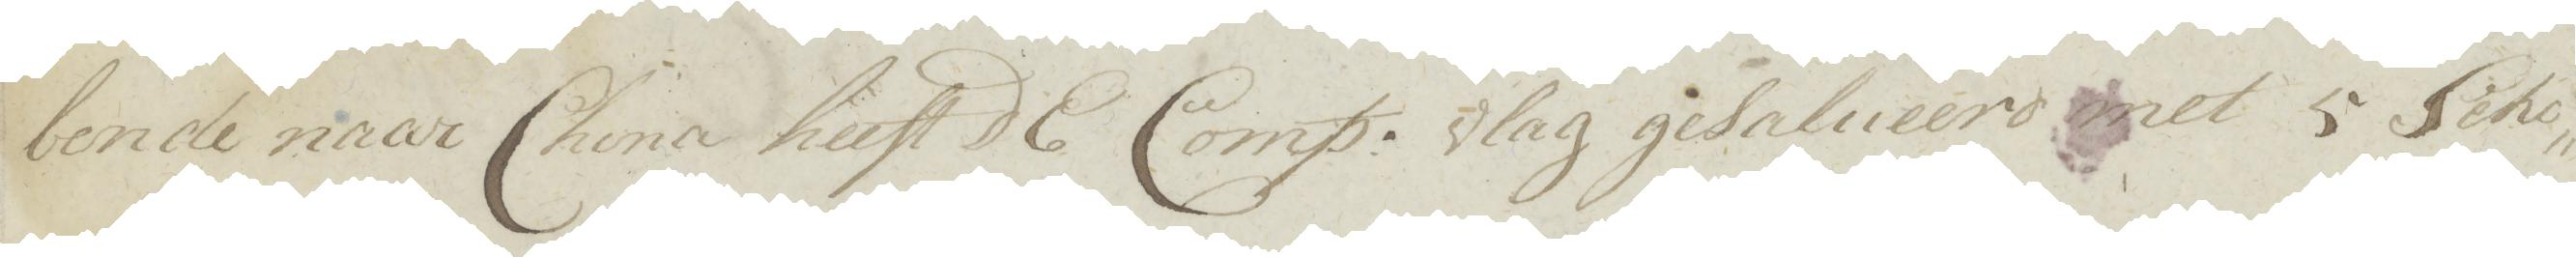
bende naar China heeft d E Comp. vlag gesalueerd met 5 scho„
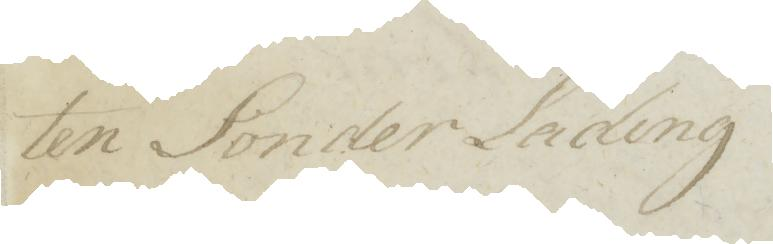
ten sonder Lading
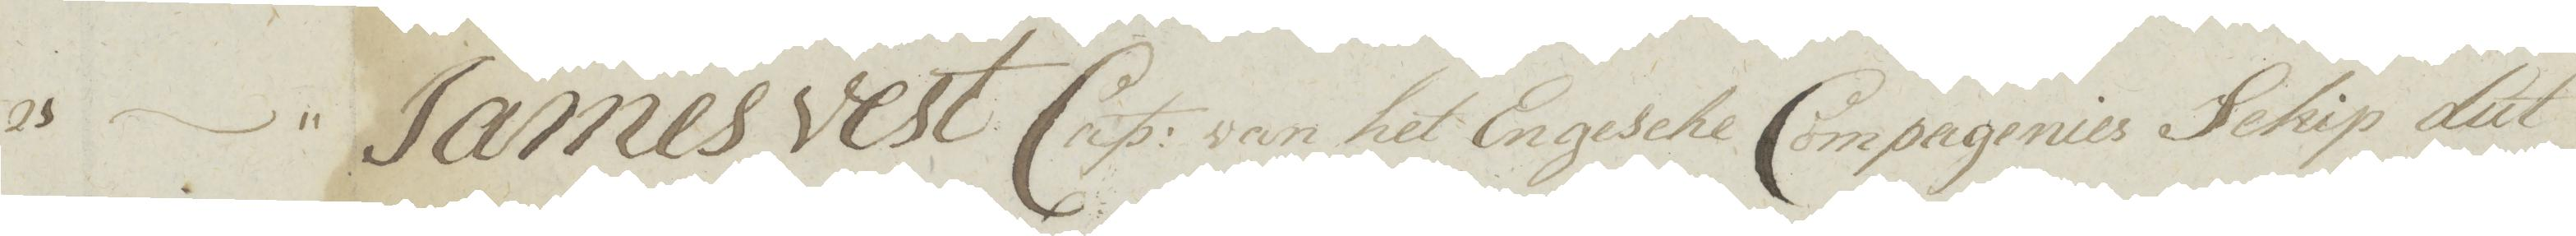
25 _ „ James vest Cap: van het Engesche Compagenies schip dut
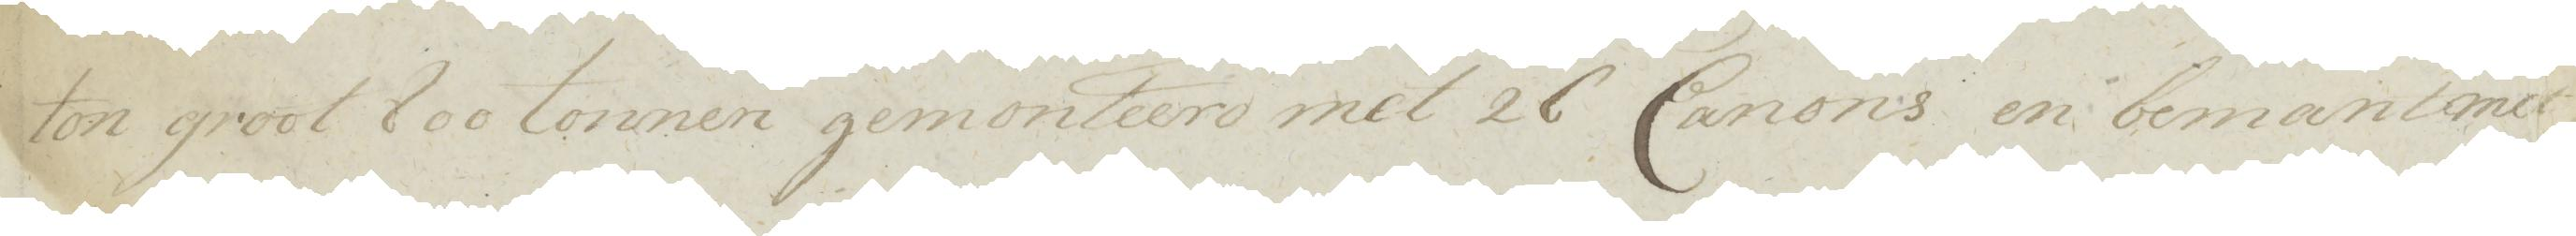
ton groot 800 tonnen gemonteerd met 26 Canons en bemant met
